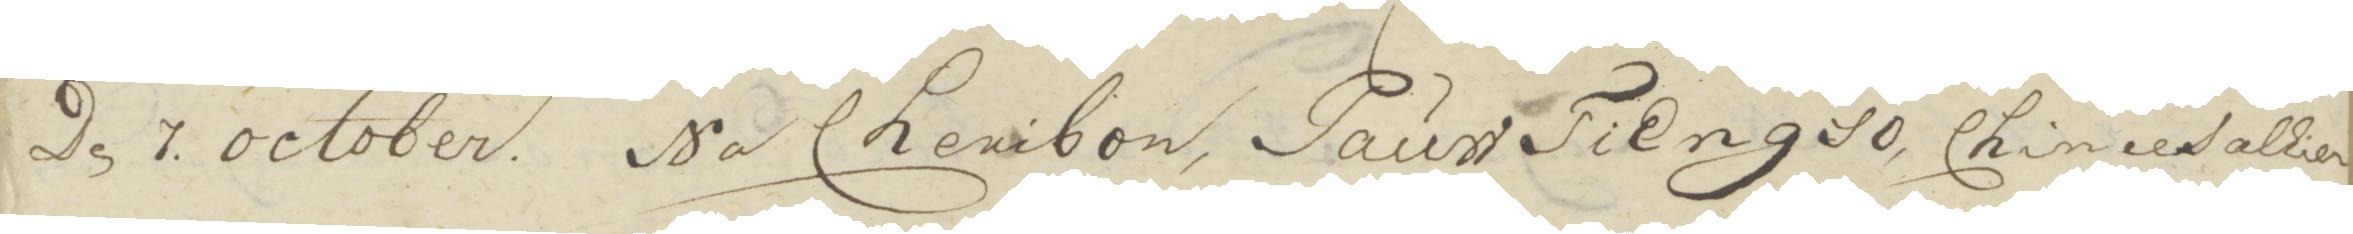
Den 7. october. Na Cheribon, Pauw Ti Engso, Chinees alhier
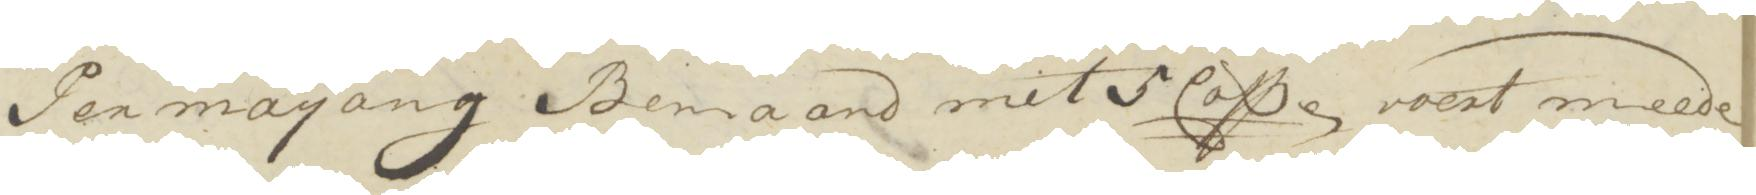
Per maijang Bemaand met 5 Coppen voert meede
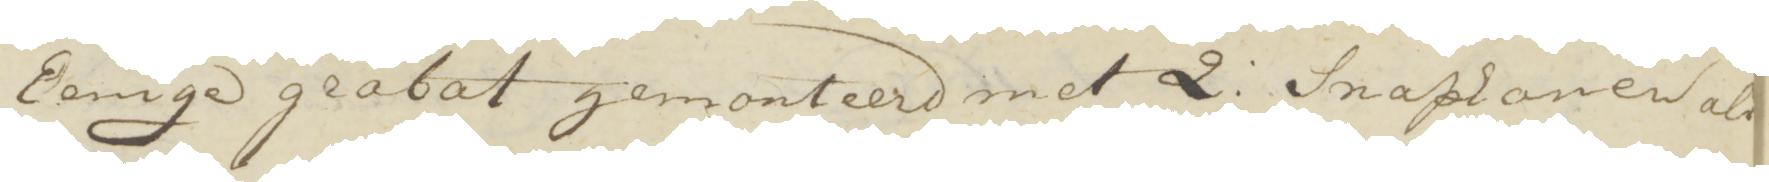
Eenige grabat gemonteerd met 2: snaphanen als
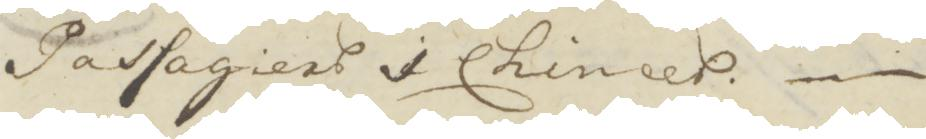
Passagiers 1 Chinees. —
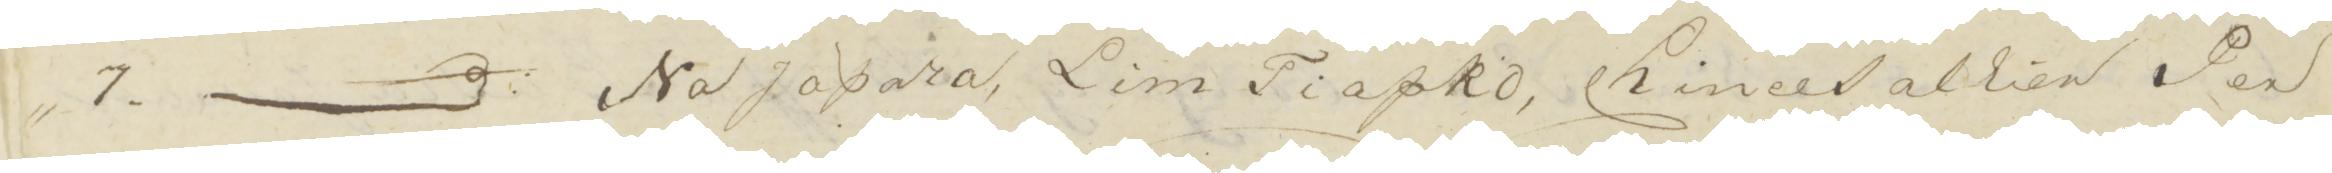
„ 7. _:o Na Japara, Lim Tiapko, Chinees alhier Per
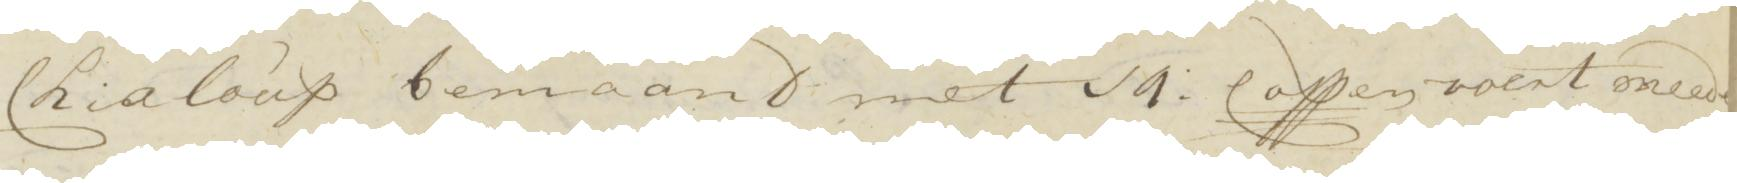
Chialoup bemaand met 14: Coppen voert meed
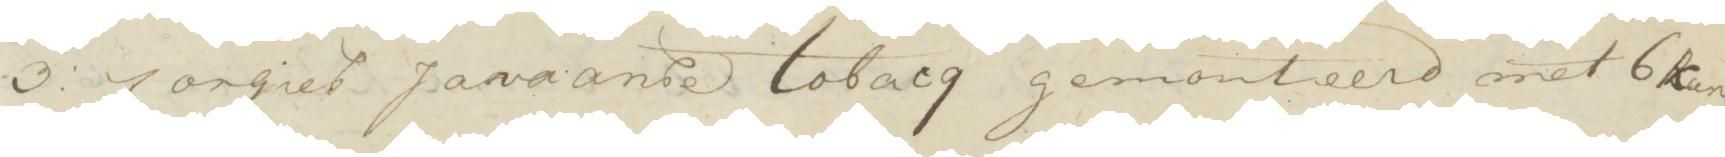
3: corgies Javaanse tobacq gemonteerd met 6 ka
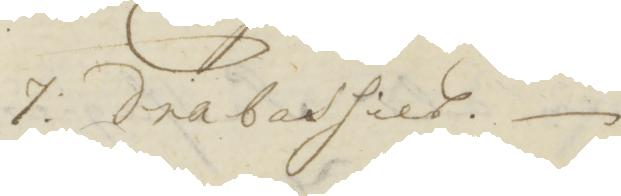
7: drabassies. —
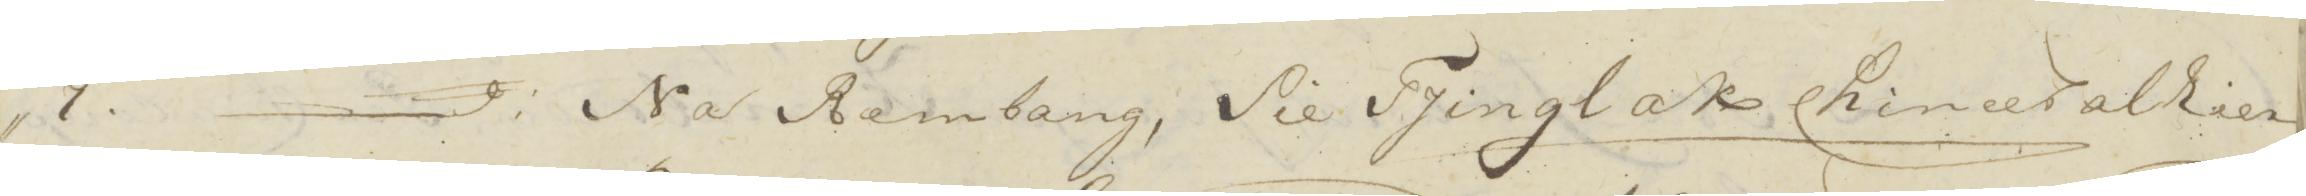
„ 7. _:o Na Rembang, Sie Tjinglak Chinees alhier
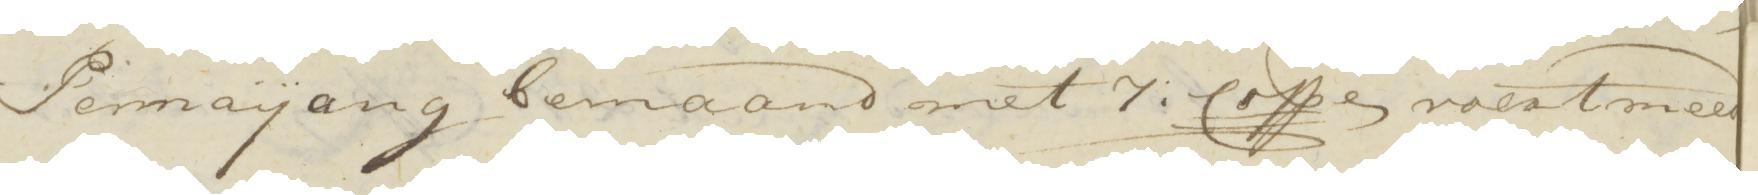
Permaijang bemaand met 7: Coppen voert meed
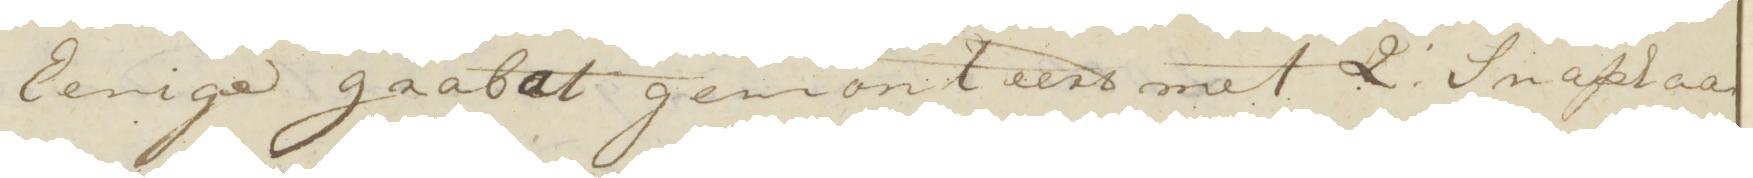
Eenige grabat gemonteerd met 2: snaphaa
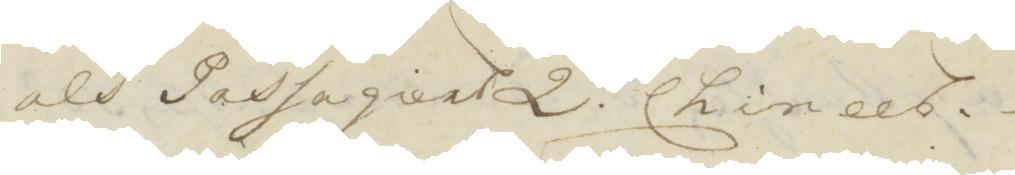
als Passagiers 2: Chinees.
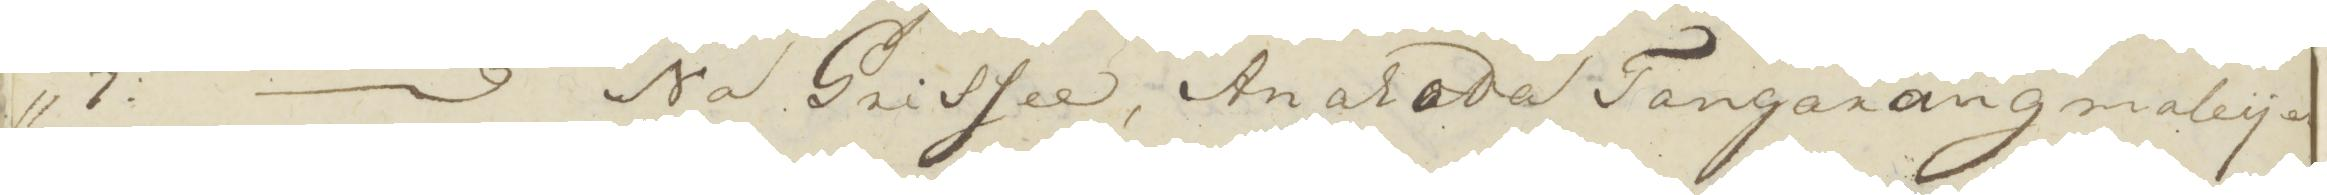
„ 7: _o Na Grissee, Anahoda Tangarang maleije
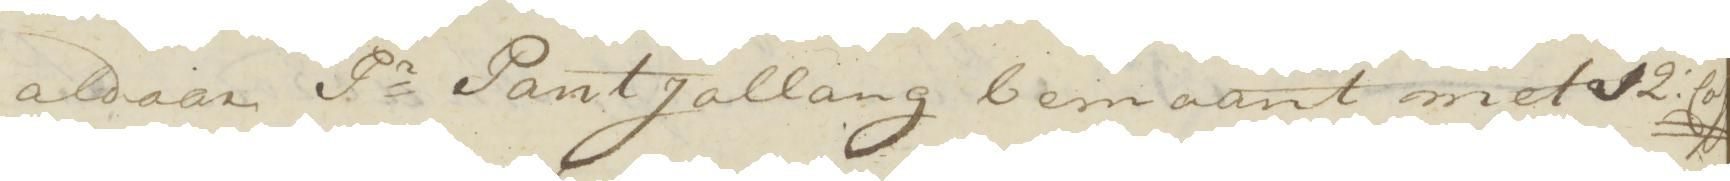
aldaar P=r Pantjallang bemaant met 12: Co
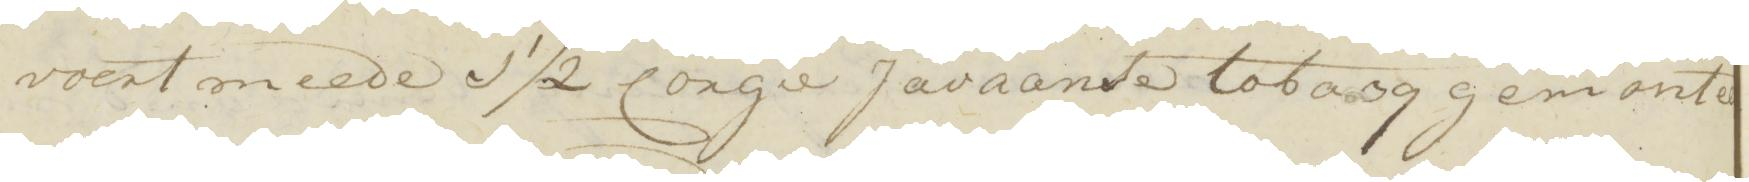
voert meede 1½ Corgie Javaanse tobacq gemonte
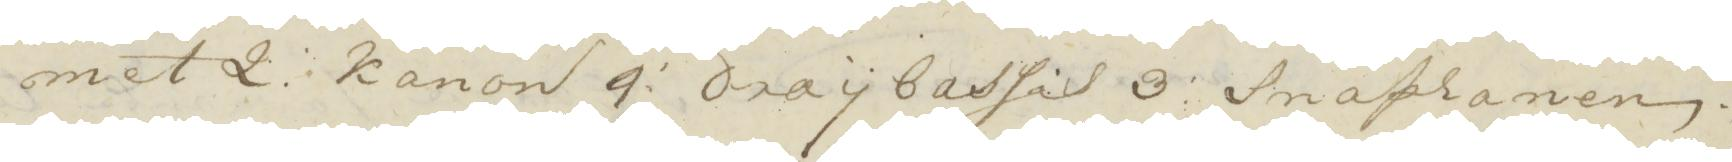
met 2: kanon 4: draijbassis 3: snaphanen
